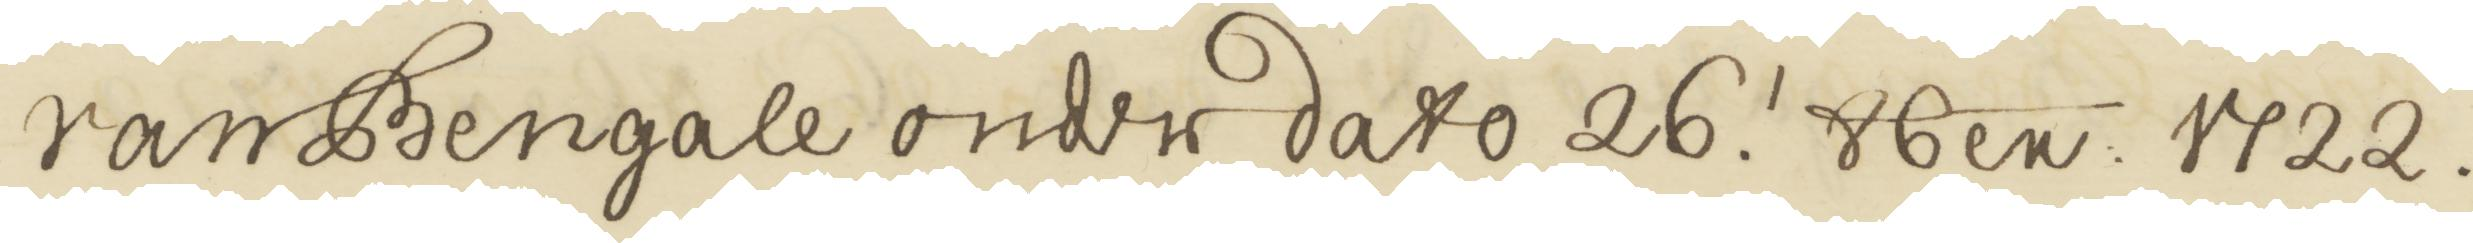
van Bengale onder dato 26.' 8ber: 1722
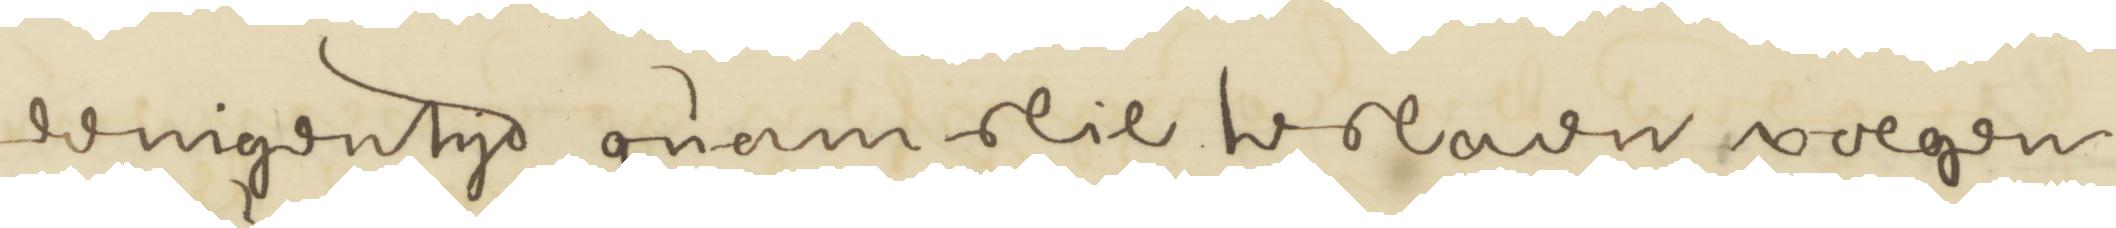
eenigen tijd quam stil te staen volgen
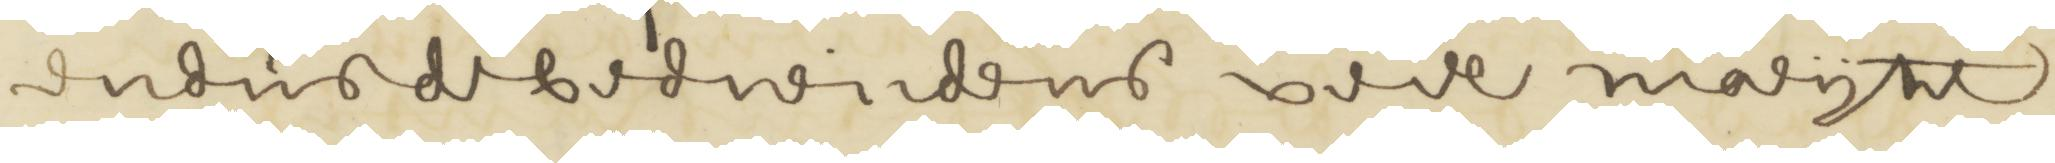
en dus de bediendens veel moeijte
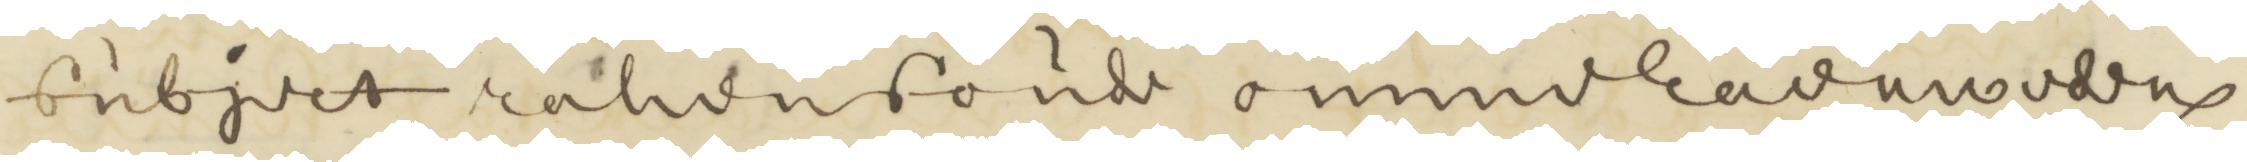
subject raken soude omme haer weder
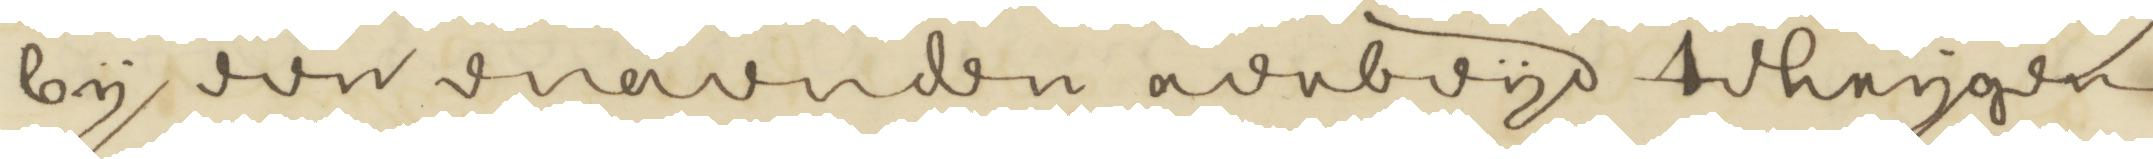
bij een en aen den aerbeijd te krijgen
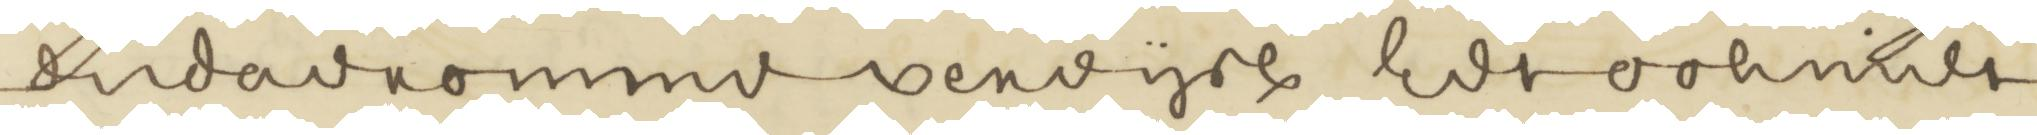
en daeromme vereijst het ook niet
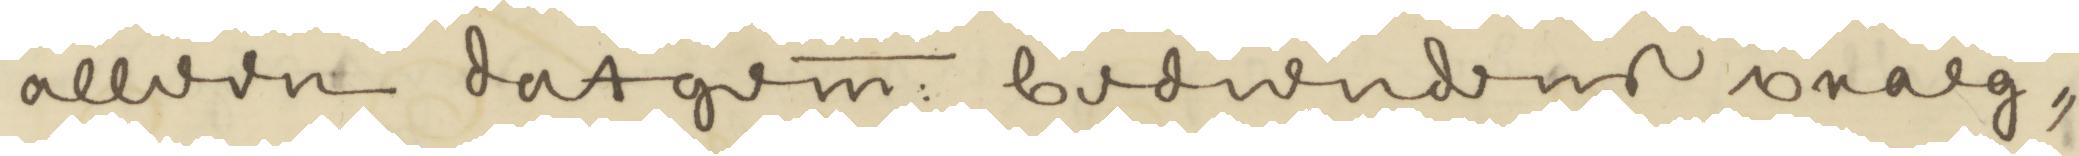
alleen dat gem: bediendens vraeg„
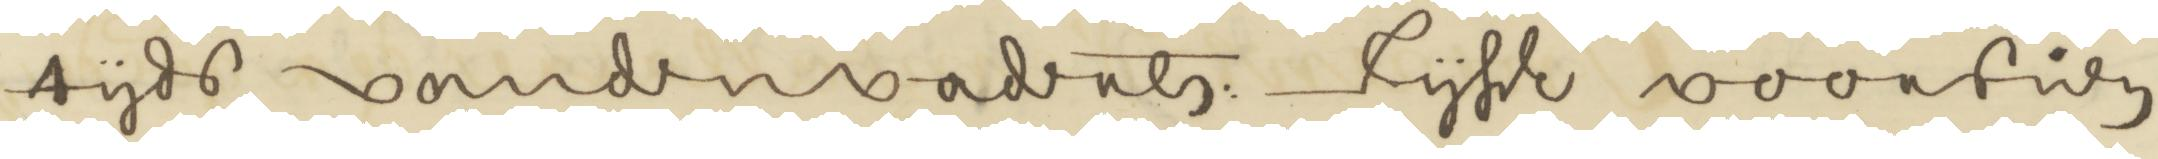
tijds vanden vaderl: Eijsch voorsien
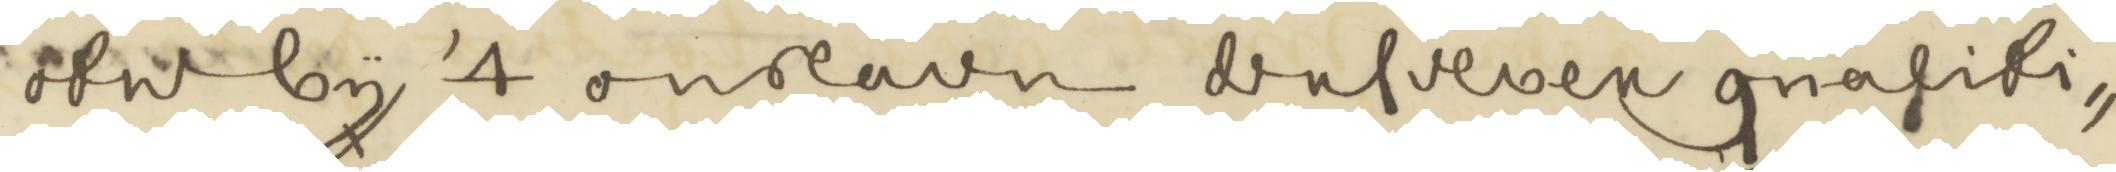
ofte bij ’t onslaen derselver qualifi„
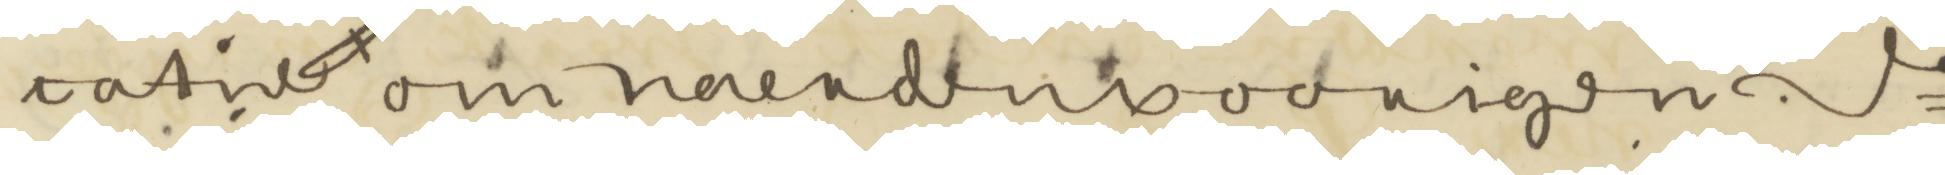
catie om naerden voorigen. D=o
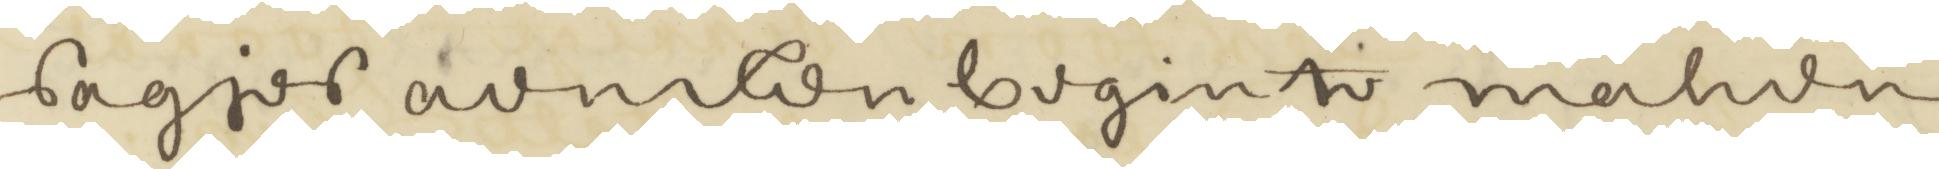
sagjes aen Een begin te maken
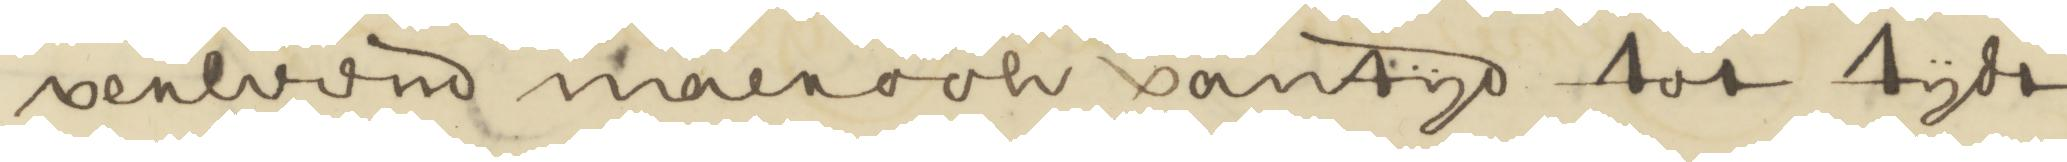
verleend maer ook van tijd tot tijdt
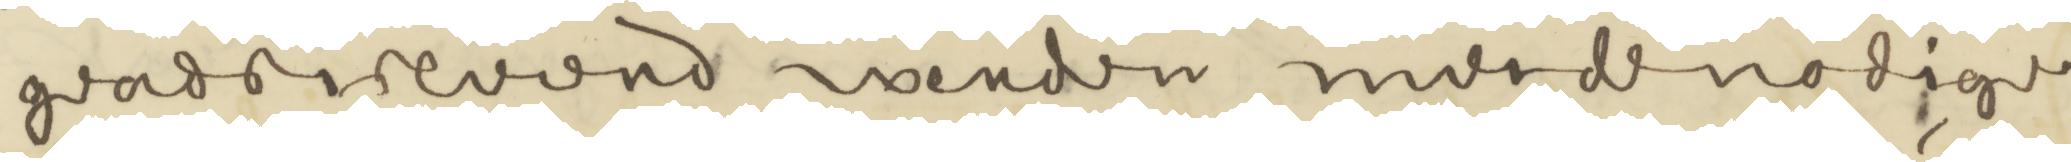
geadsisteerd werden met de nodige
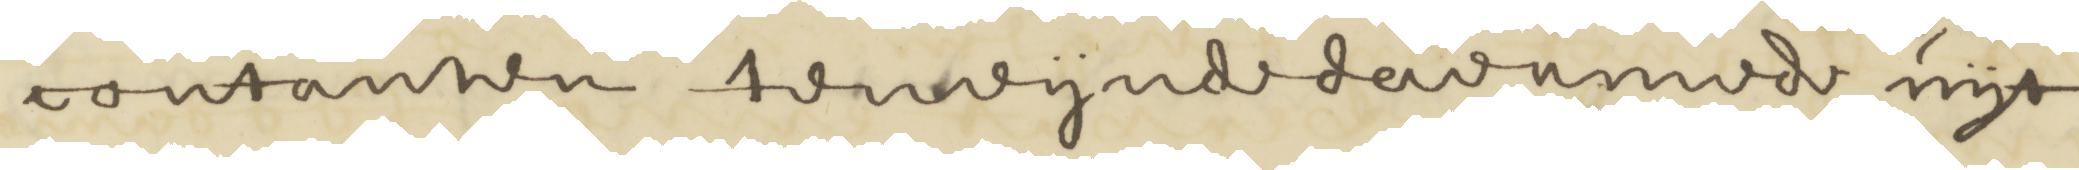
contanten teneijnde daermede uijt
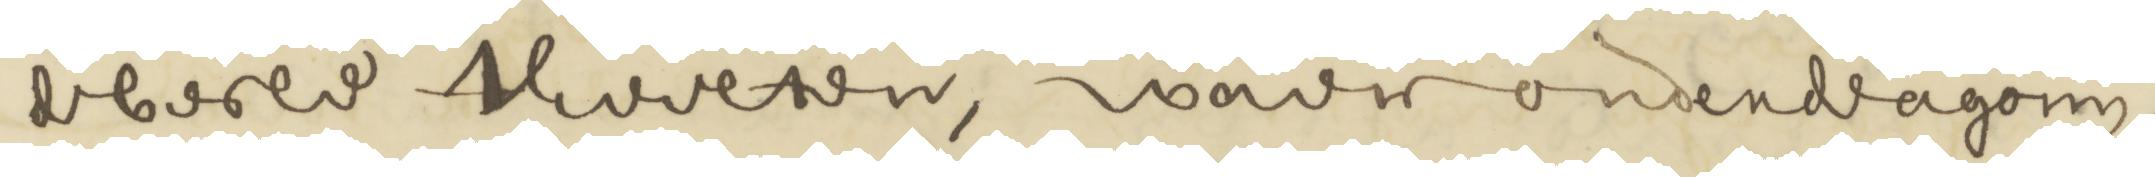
de beste theelten, waer onder de agonij
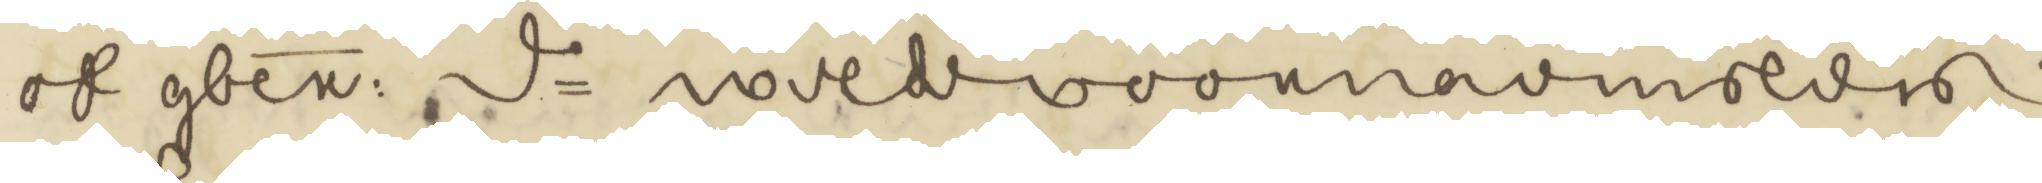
of gber: D=o wel de voornaemste is
